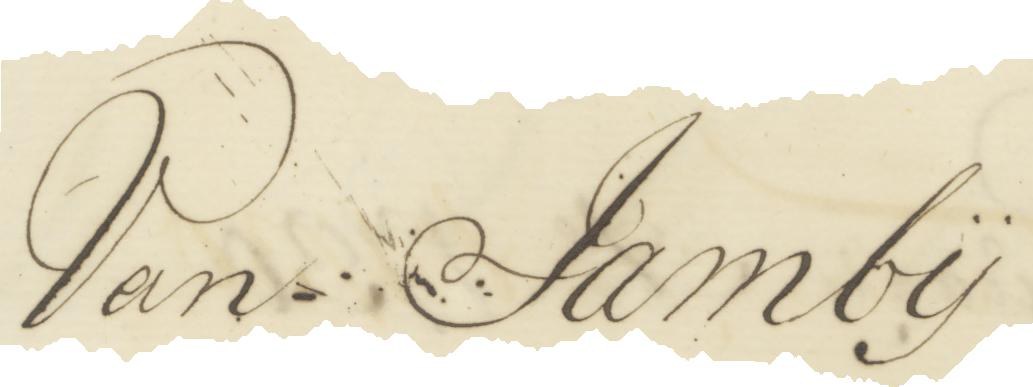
Van Jambij
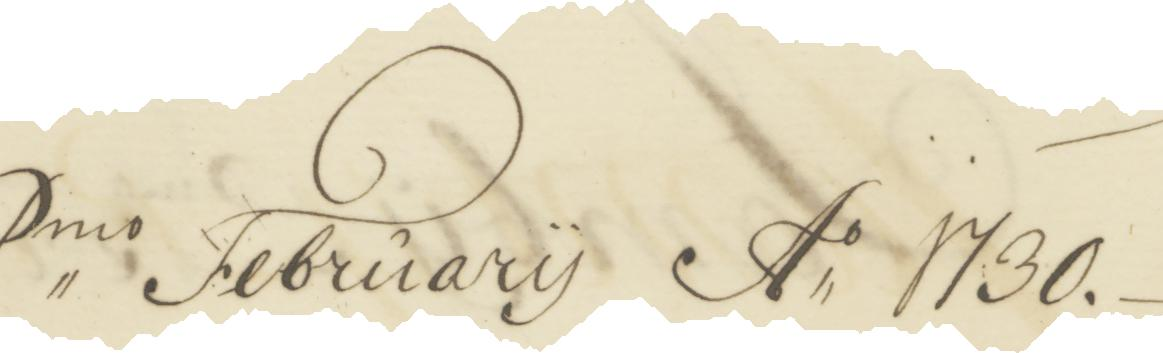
P„mo Februarij A„o 1730. –
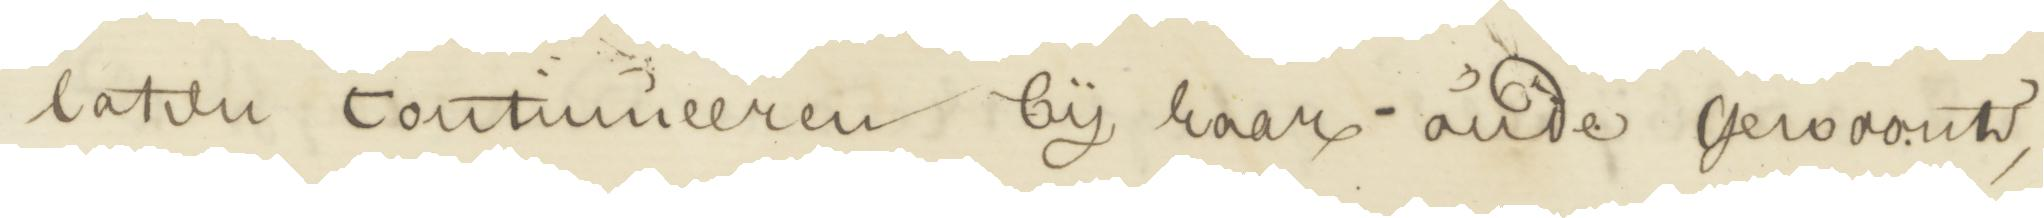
laten continueeren bij haar oude gewoonte,
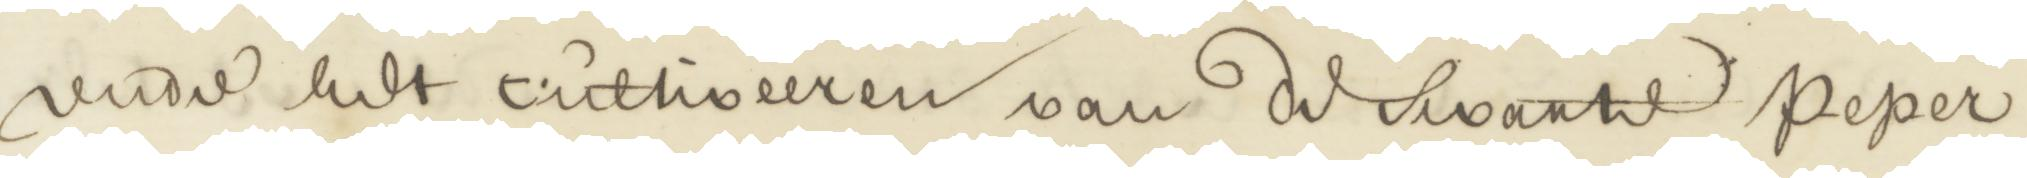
ende het cultiveeren van de swarte peper
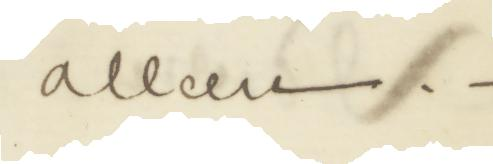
alleen . –
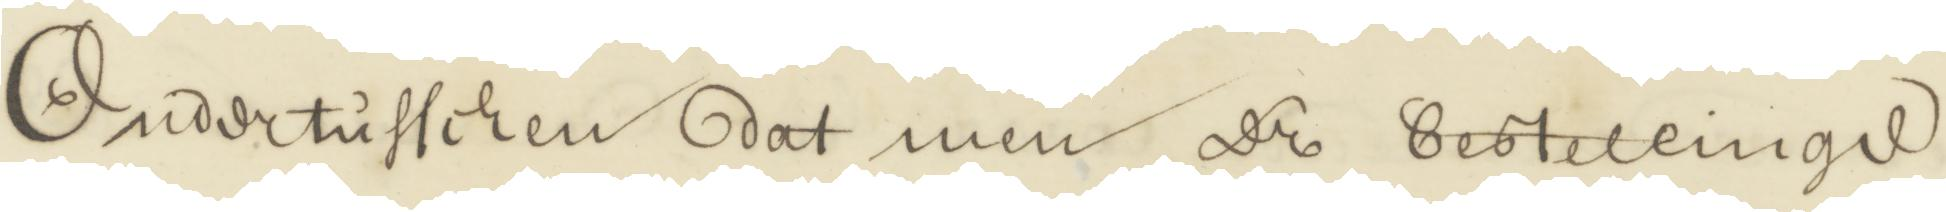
Ondertusschen dat men ter bestellinge
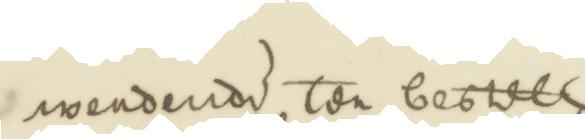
werdende ter bestel
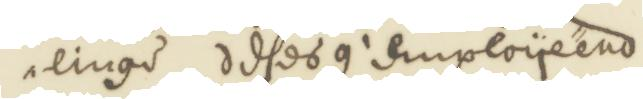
„linge deses g’emploijeerd
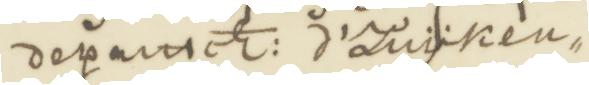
depantch: d’zuijker„
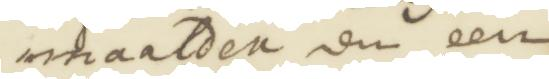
maalder en een
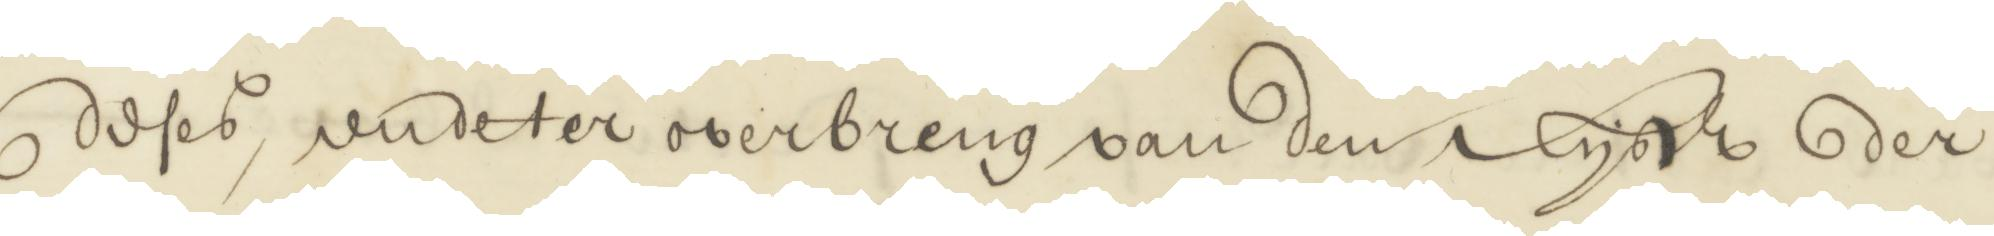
deses, ende ter overbreng van den Eijsch der
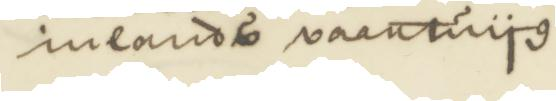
inlands vaartuijg
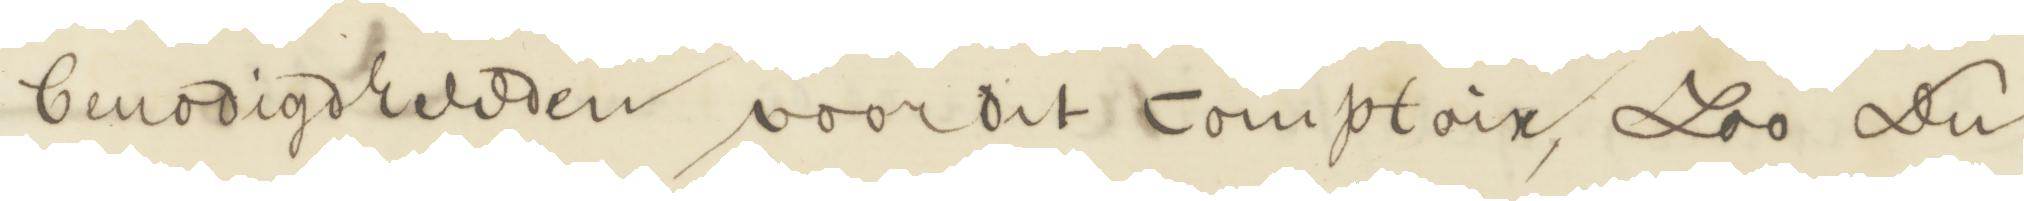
benodigdheeden voor dit comptoir, zoo ten
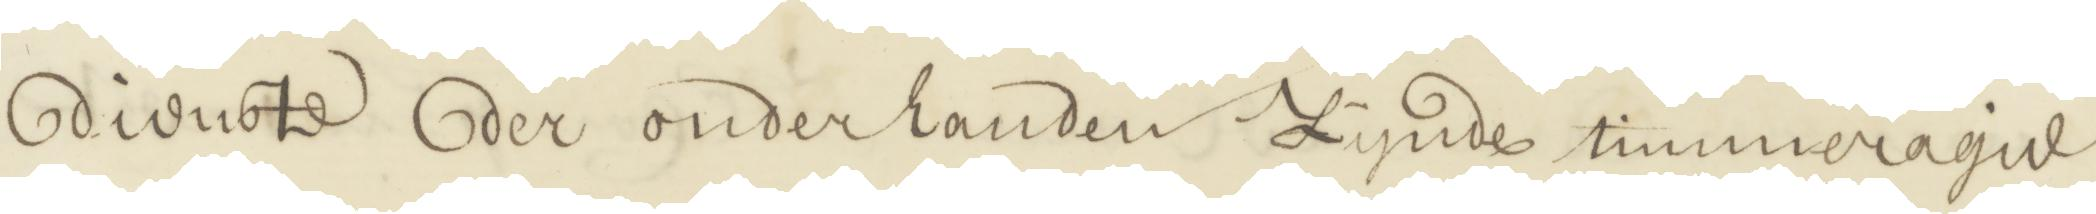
dienste der onderhanden, zijnde timmeragie
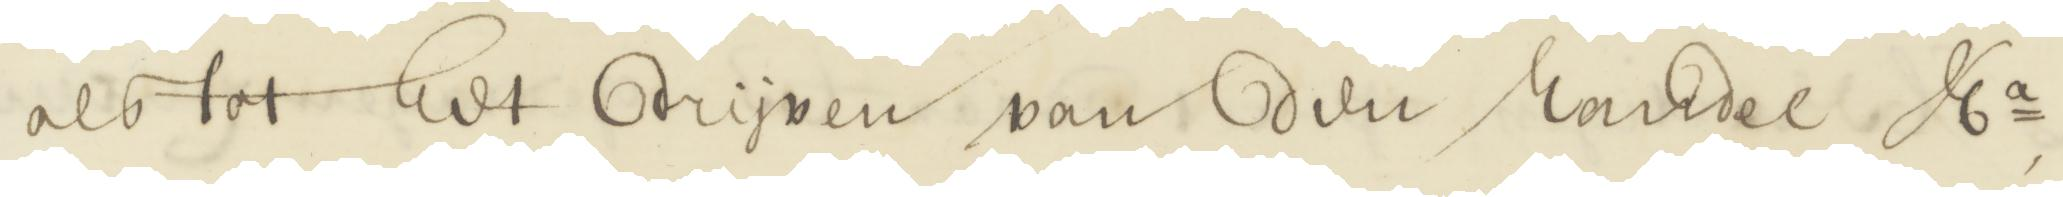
als tot het drijven van den handel &c=a
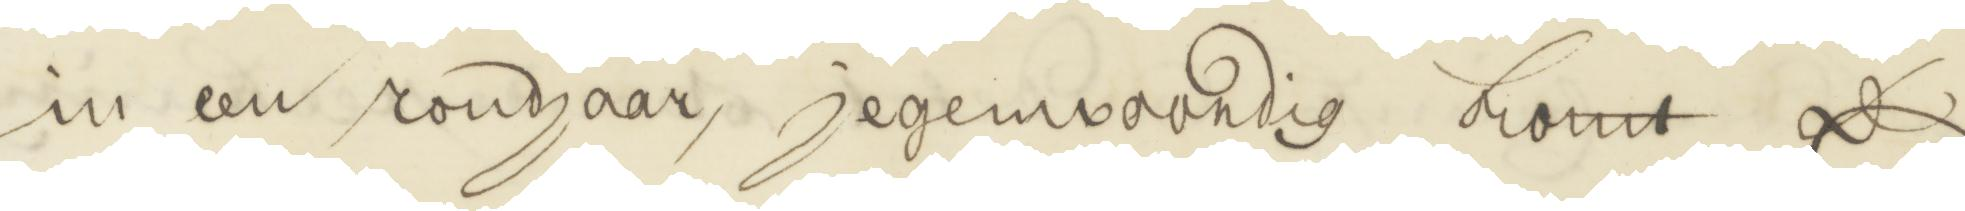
in een rondjaar, jegenwoordig komt te
